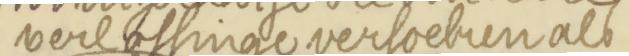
verlossinge versoeken als
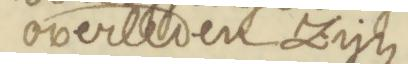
overleden zijn
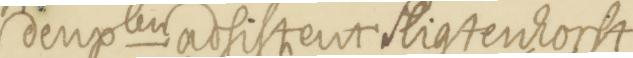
den p-len adsistent sligtenhorst
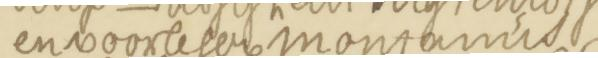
en voorleser montanus
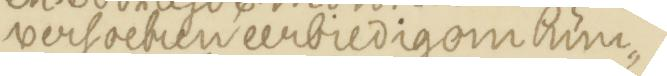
versoeken eerbiedig om hun„
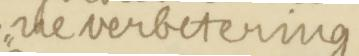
„ne verbetering
